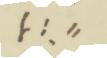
1: „
